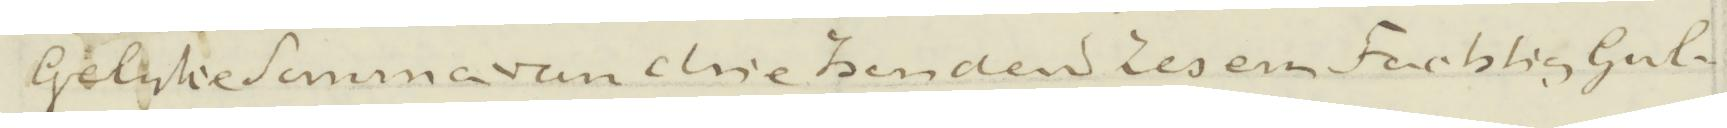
Gelyke Somma van drie honderd zes en Tachtig Gul-
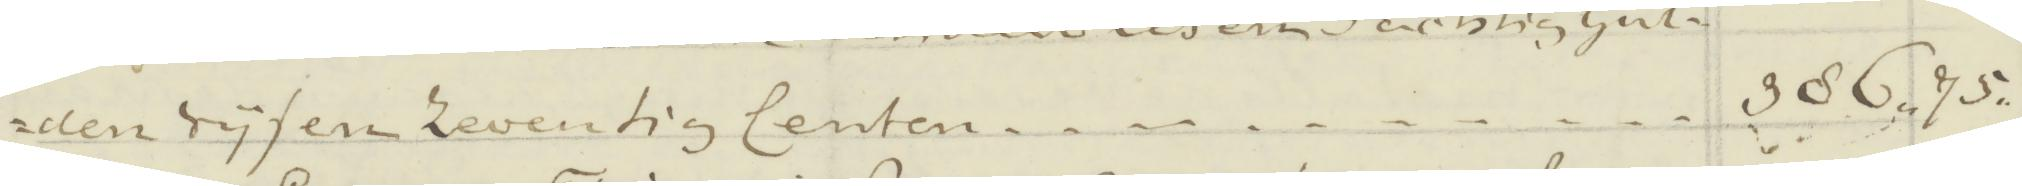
=den vijfen zeventig Centen - - - - - - - - - - - 386„75„
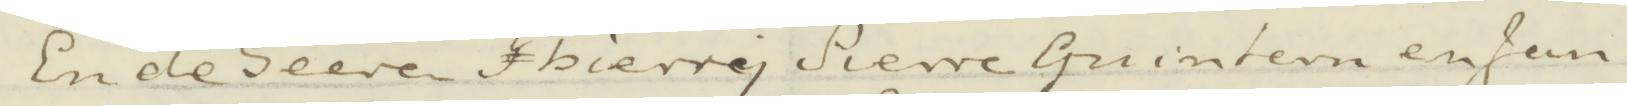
En de heere Thierrij Pierre Quintern en Jan
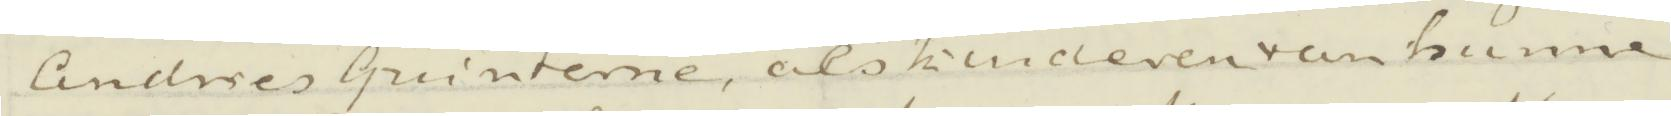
Andries Quinterne, als kinderen van hunne
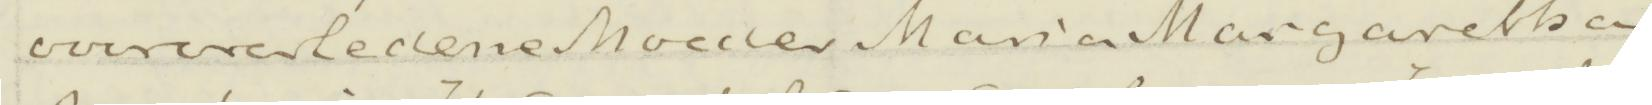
vooroverledene Moeder Maria Margaretha
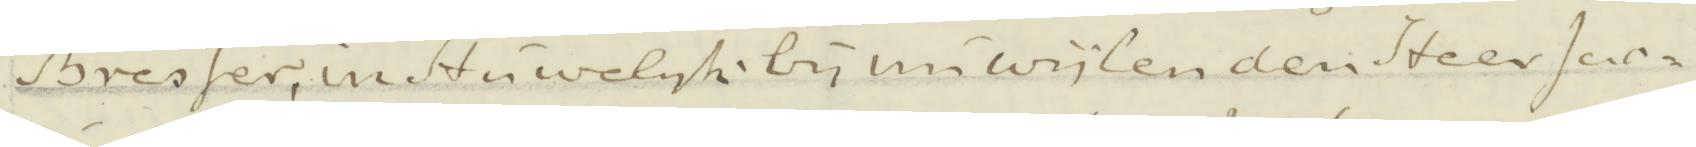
Bresser, in Huwelyk bij nu wijlen den Heer Jac=
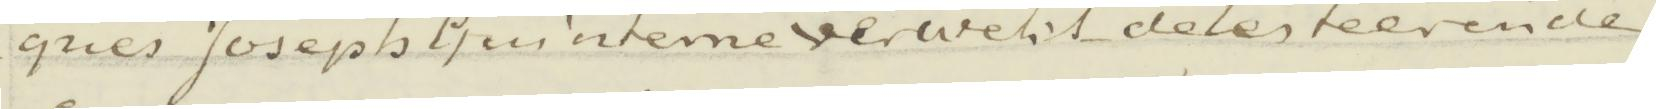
ques Joseph Quinterne verwekt de resteerende
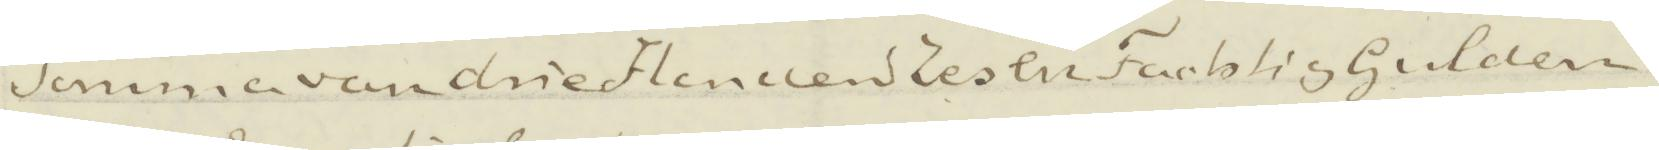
Somma van drie Honderd zes en Tachtig Gulden
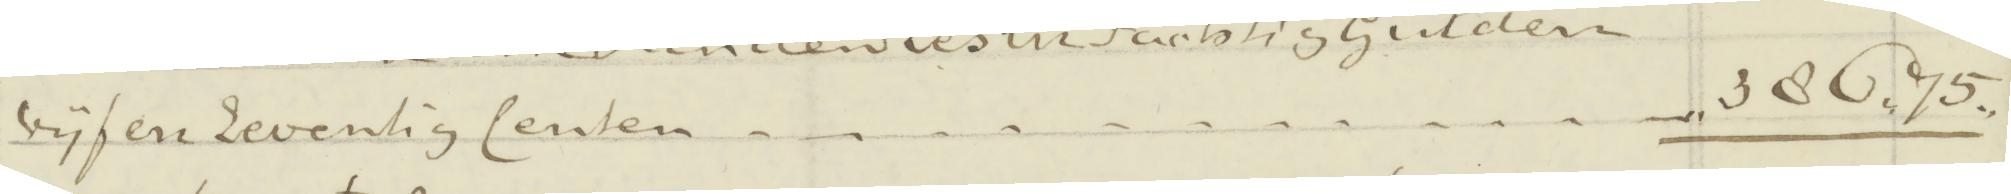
vijf en Zeventig Centen - - - - - - - - - - - - „ 386„75„
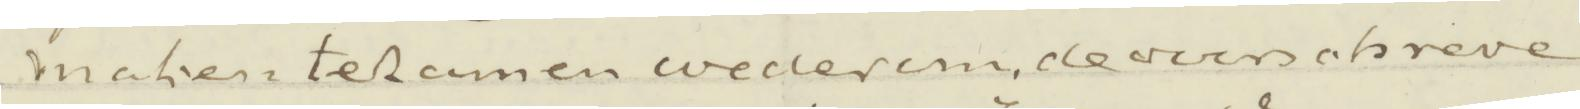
maken tezamen wederom, de voorschreve
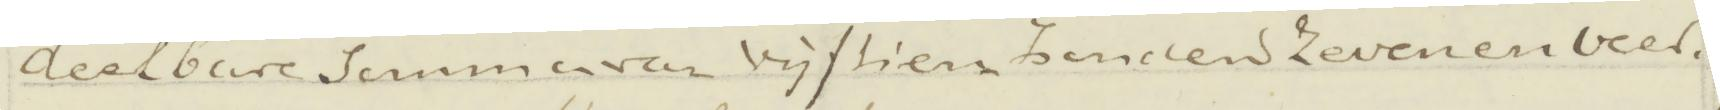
deelbare somma van vijftien honderd zeven en veer„
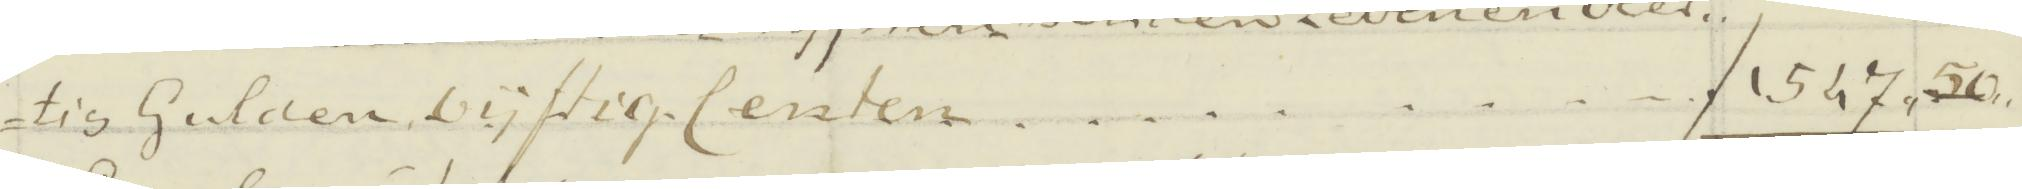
=tig Gulden vijftig Centen - - - - - - - - - . ƒ1547„50„
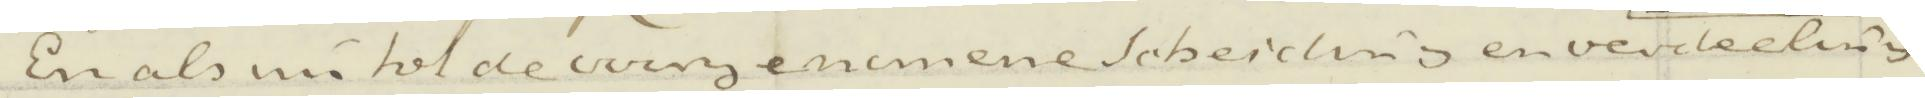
En als nu tot de voorgenomene scheiding en verdeeling
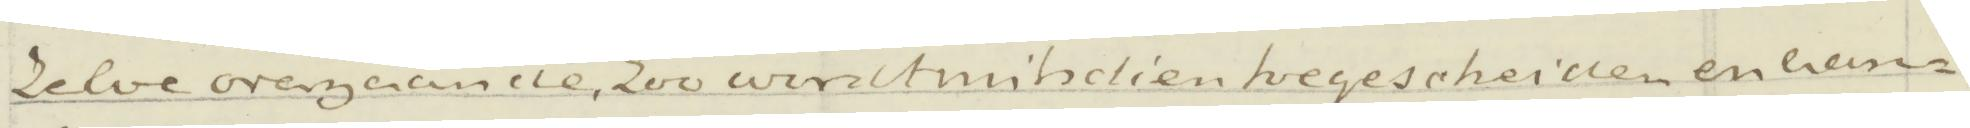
zelve overgaande, zoo wordt mitsdien toegescheiden en aan=
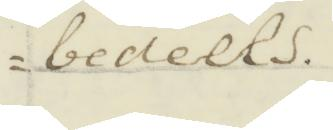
=bedeeld.
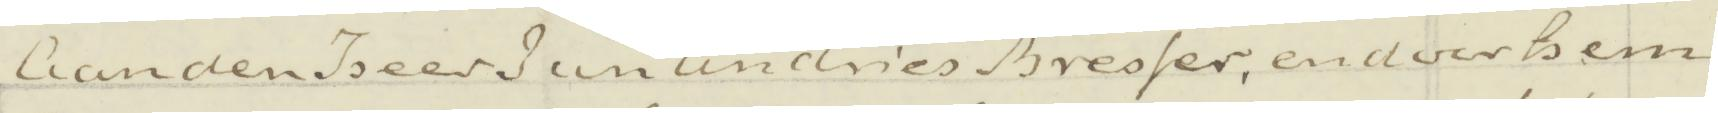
Aan den heer Jan Andries Bresser, en door hem
